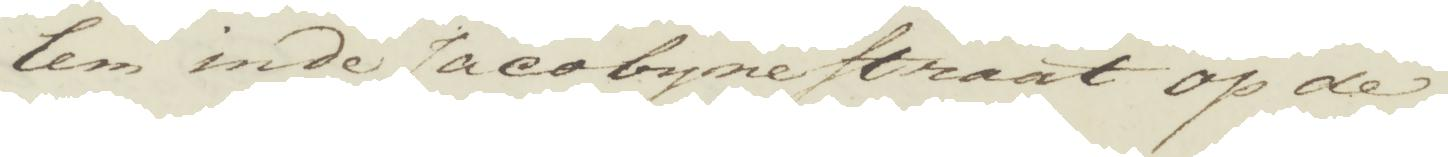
lem in de Jacobynestraat op de
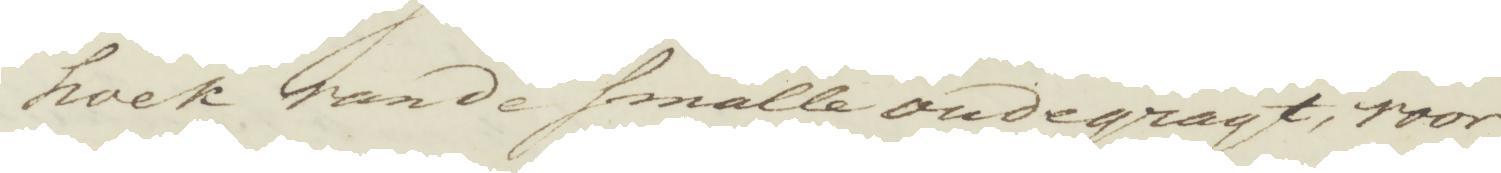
hoek van de smalle oudegragt, voor
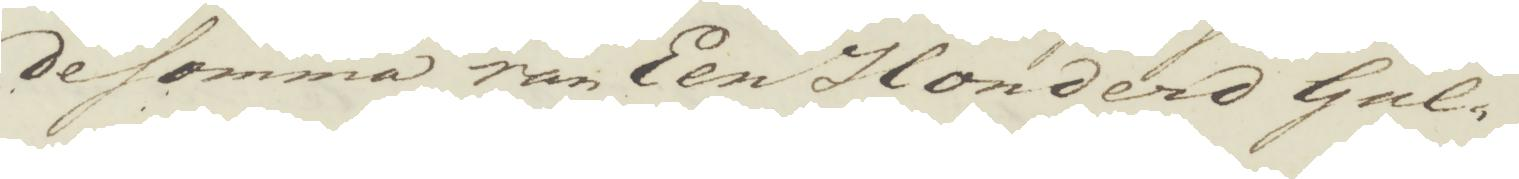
de somma van Een Honderd Gul„
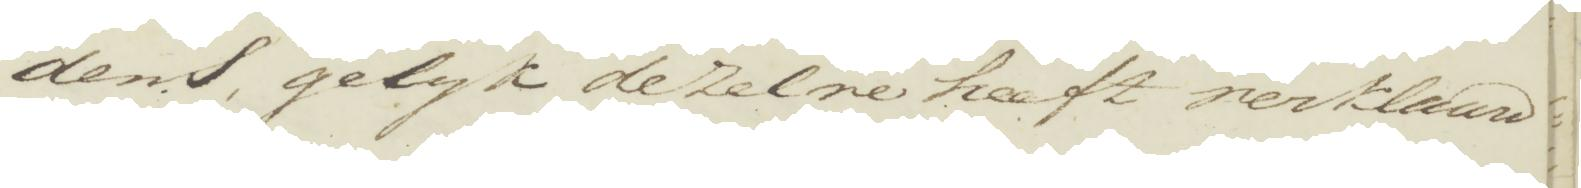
dens, gelijk dezelve heeft verklaard
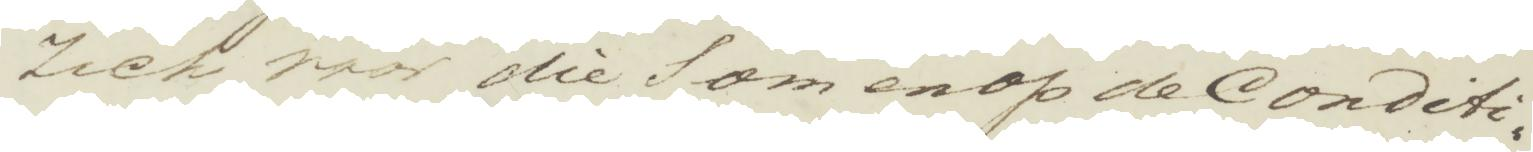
zich van die som en op de conditi„
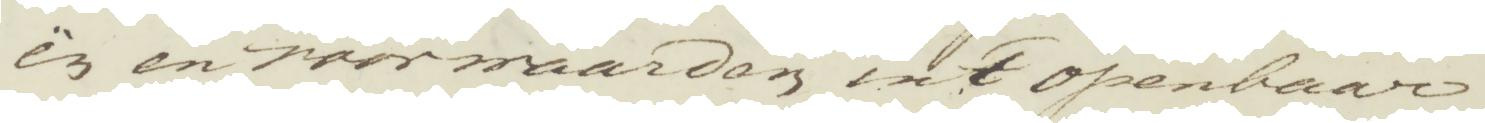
ën en voorwaarden in ’t openbaar
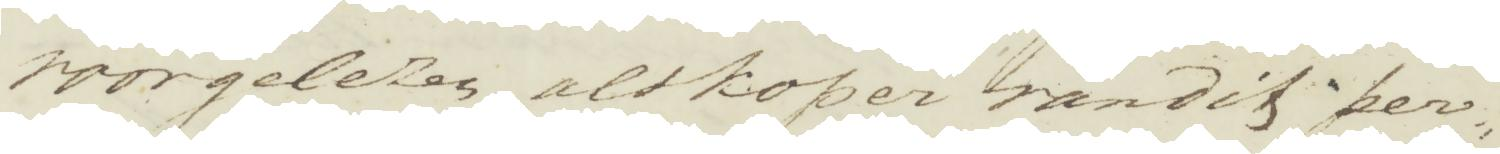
voorgelezen, als koper van dit per„
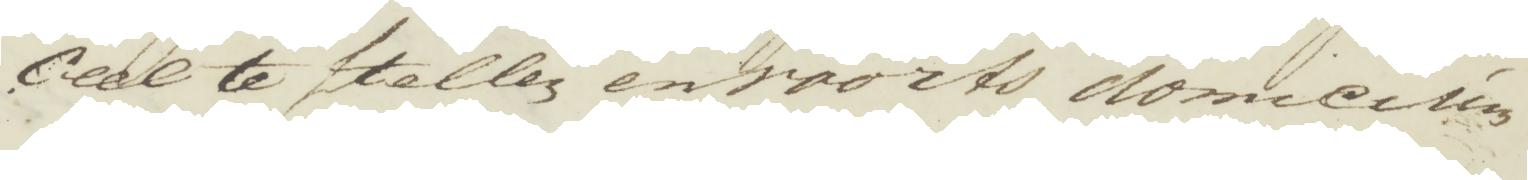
ceel te stellen en voorts domicilium
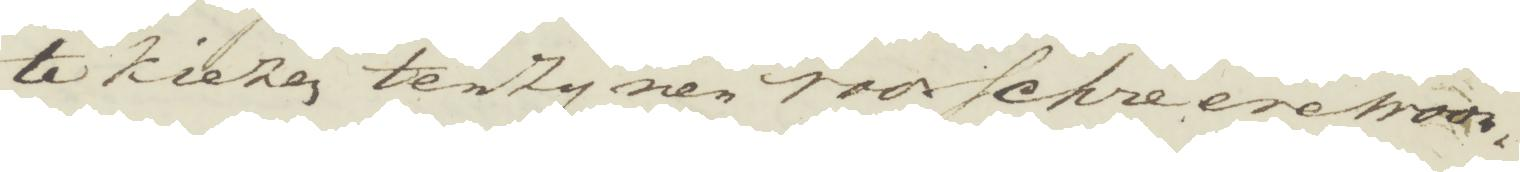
te kiezen ten zijnen voorschreeve woon„
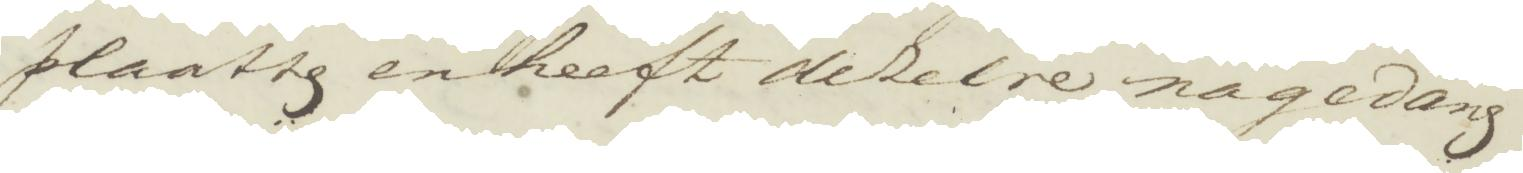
plaatsen en heeft dezelve nagedanen
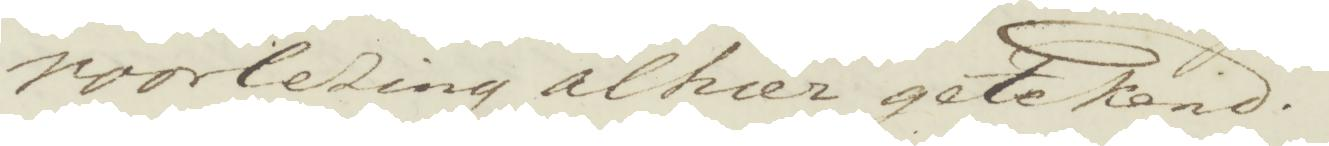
voorlezing alhier getekend.
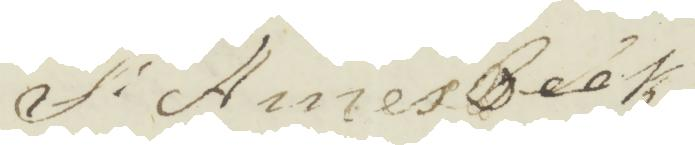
S: Amesbeek
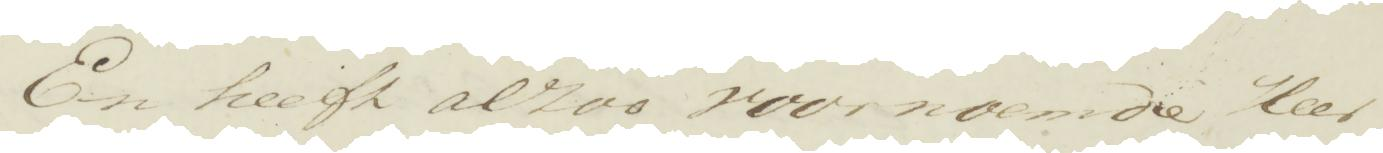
En heeft alzoo voornoemde Heer
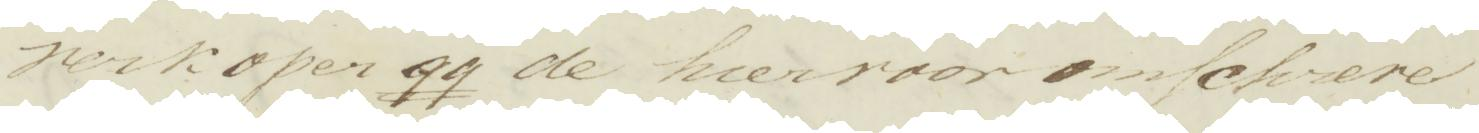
verkoper gg de hiervoor omschreve
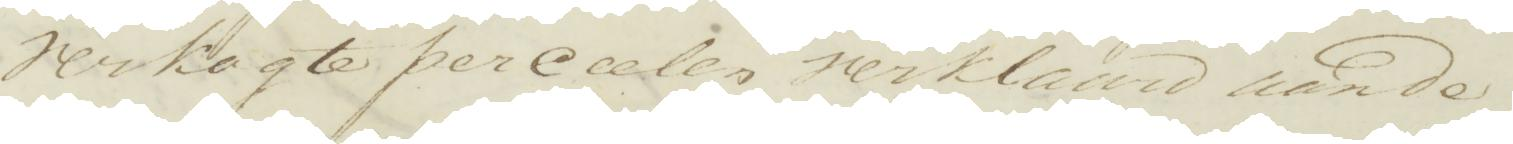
verkogte perceelen verklaard aan de
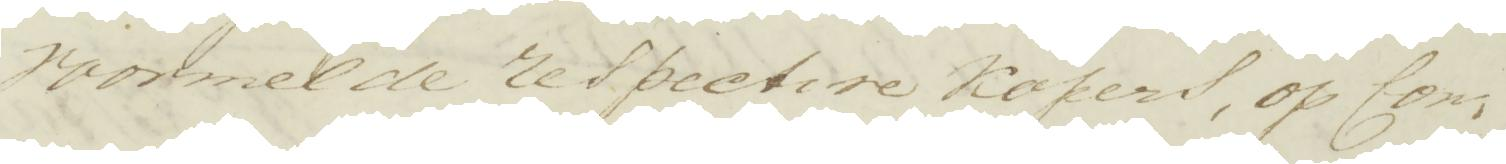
voormelde respective kopers, op Con„
